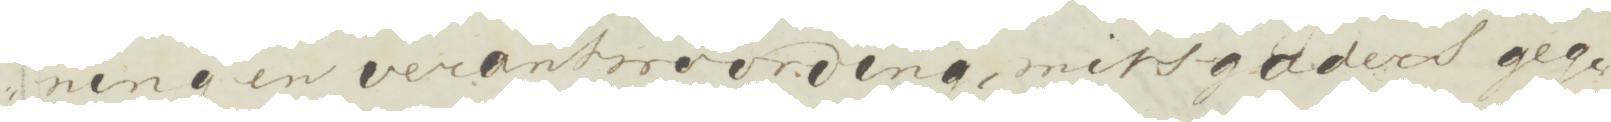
„ning en verantwoording, mitsgaders gege
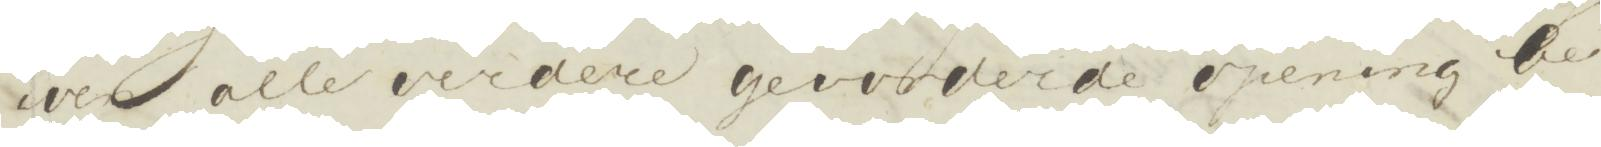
ven alle verdere gevorderde opening be
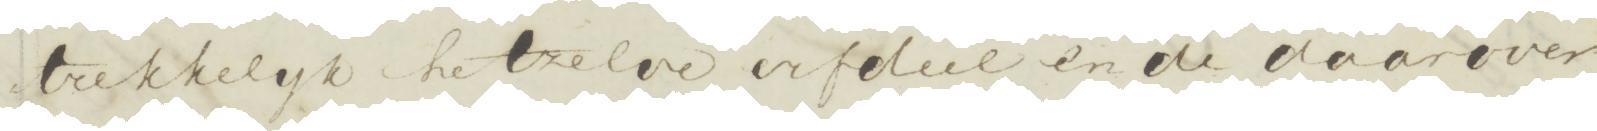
„trekkelyk hetzelve erfdeel en de daarover
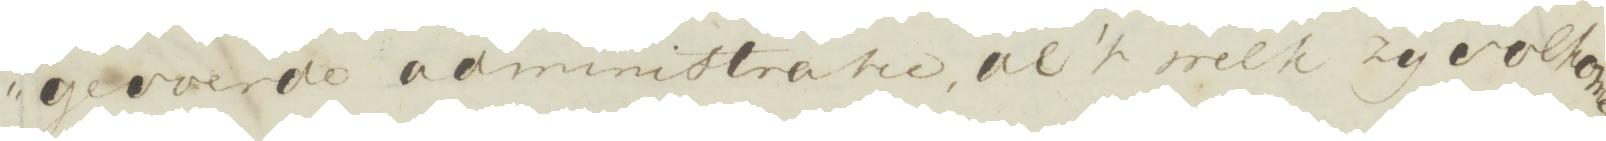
„gevoerde administratie, al ’t welk zy volkomen
